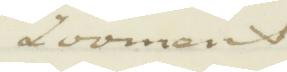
zoomers
